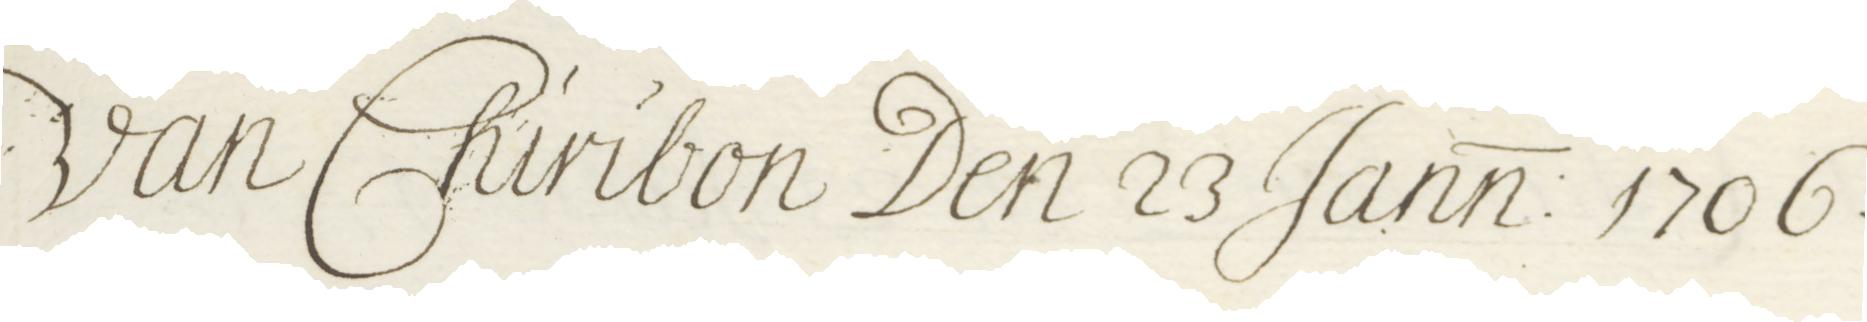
Van Chiribon Den 23 Jann: 1706.
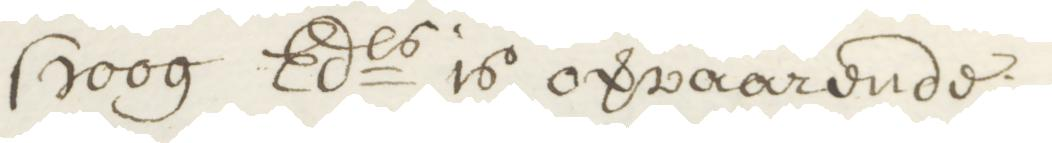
Hoog Ed=ls is overvaarende;
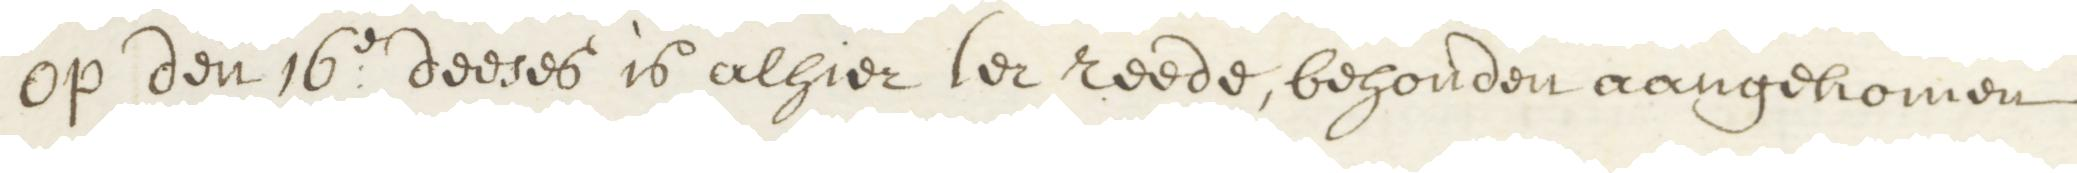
op den 16:e deeses is alhier ter reede, behouden aangekomen
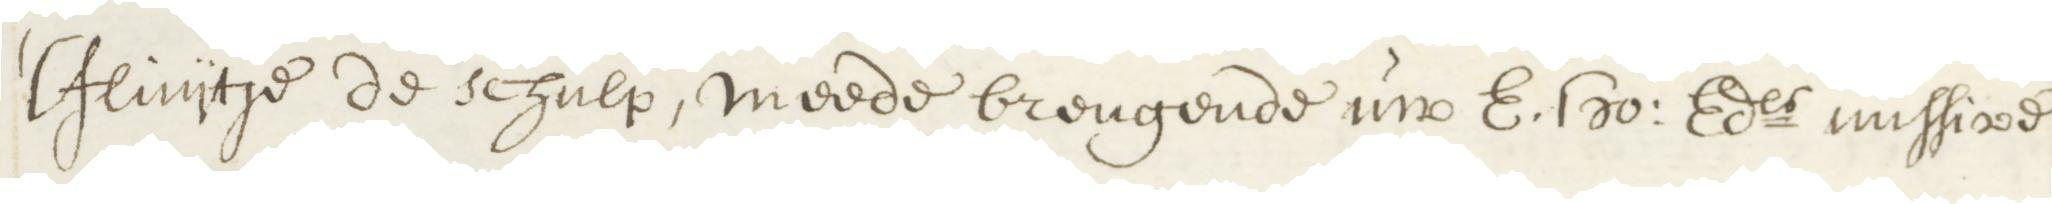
't fluijtje de schulp, meede brengende uw E. Ho: Ed=ls missive
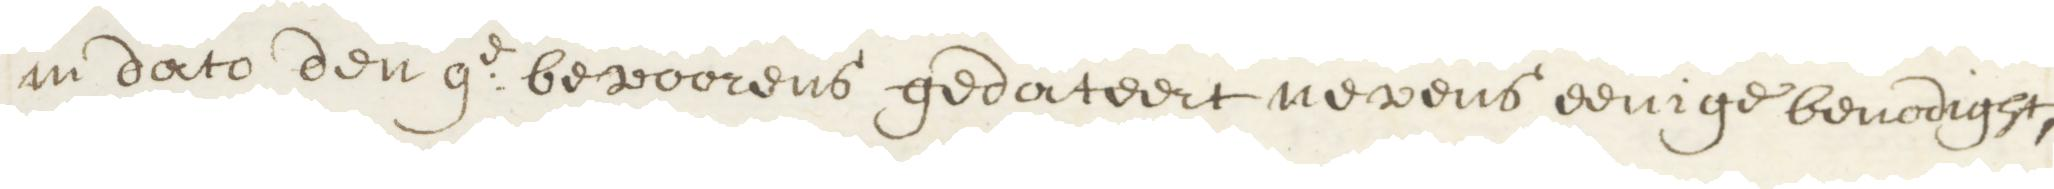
in dato den 9:e bevoorens gedateert nevens eenige benodight,
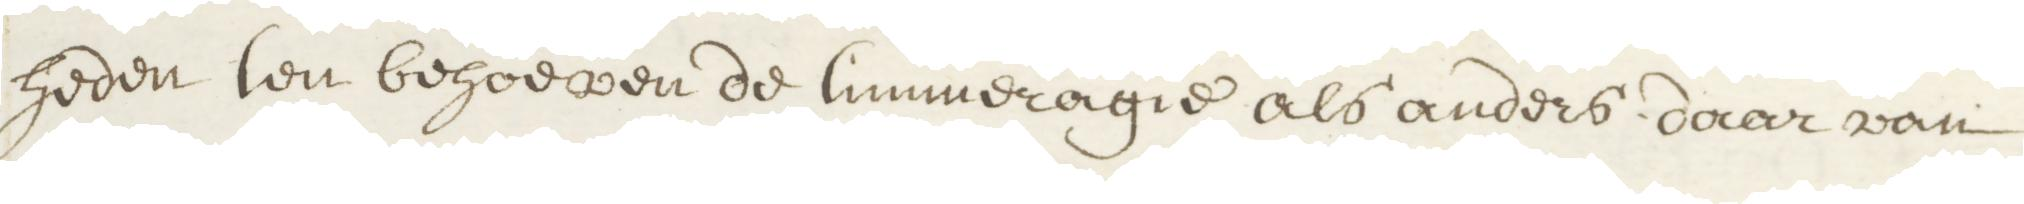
heden ten behoeven de timmeragie als anders daar van
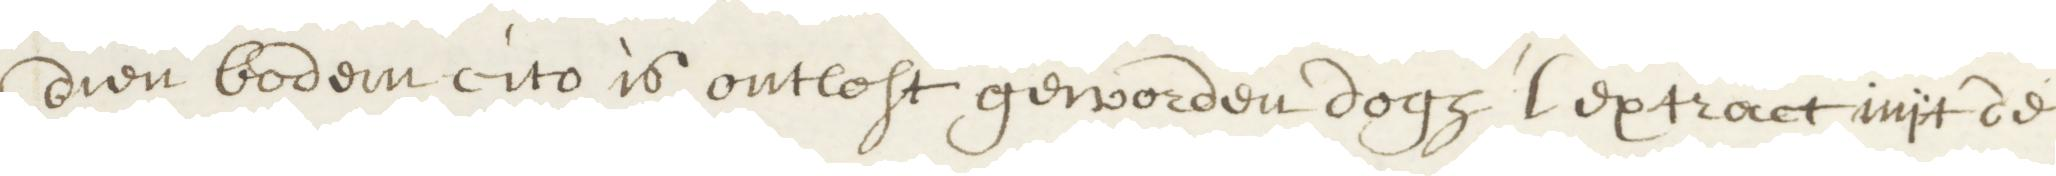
dien bodem cito is ontlost geworden dogh 't extract uijt de
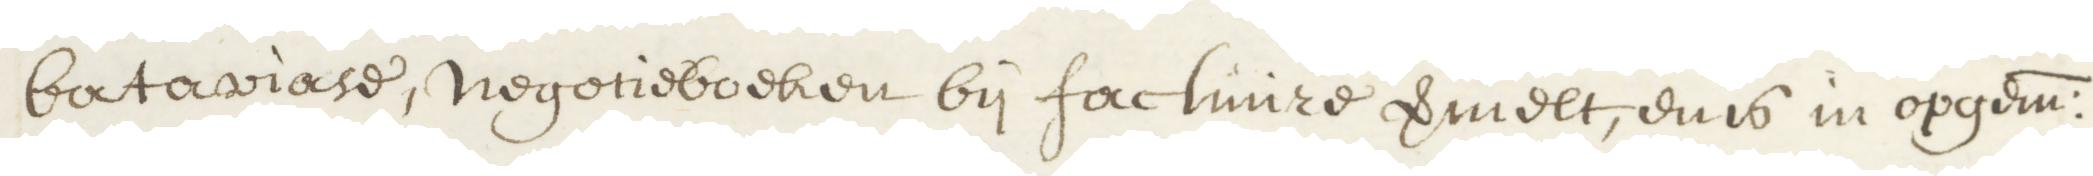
bataviase, negotieboeken bij factuure vermelt, en is in opgem:
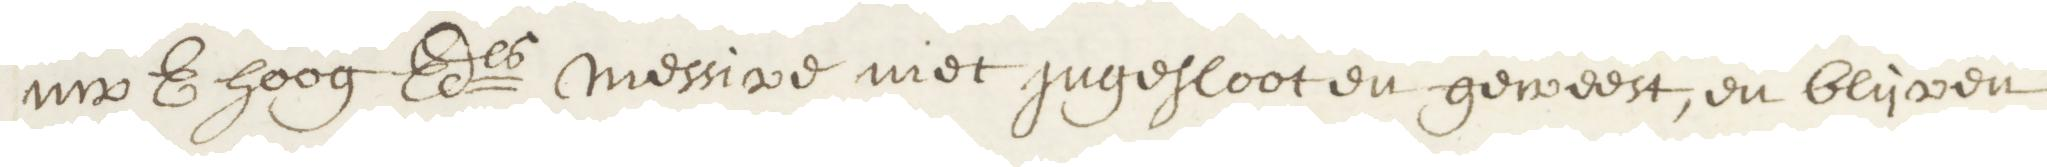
uw E Hoog Ed=ls messive niet jngeslooten geweest, en blijven
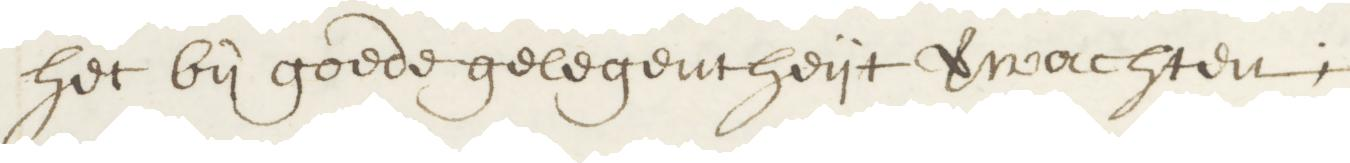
het bij goede gelegentheijt verwachten;
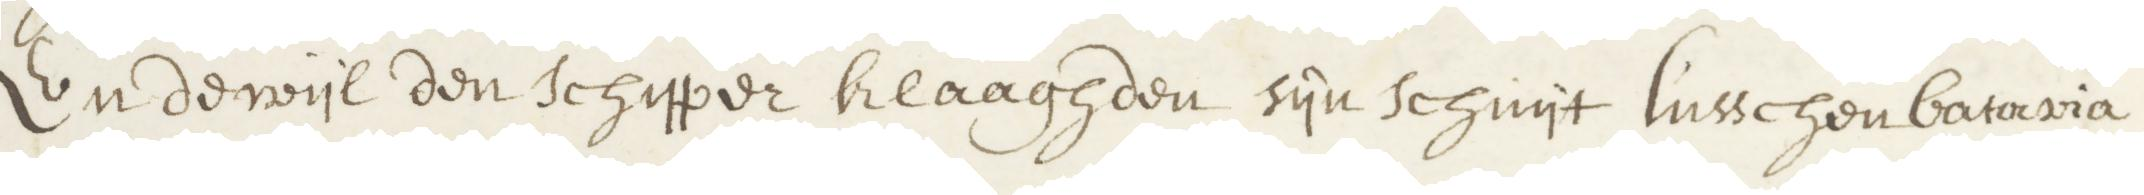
En dewijl den schipper klaaghden sijn schuijt tusschen batavia
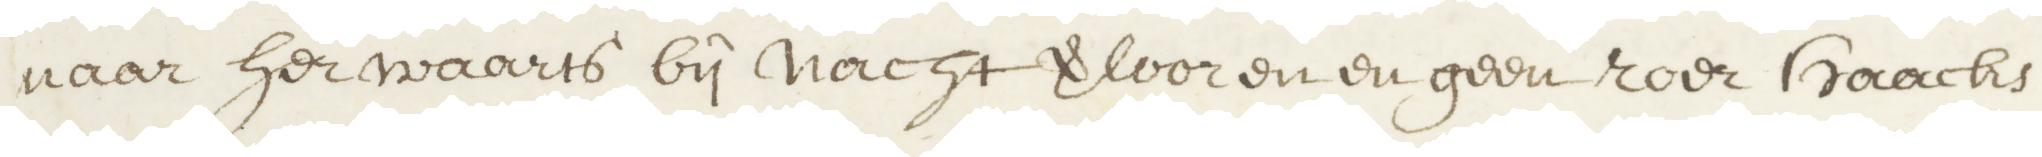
naar herwaarts bij nacht verloor enen geen roer haacks
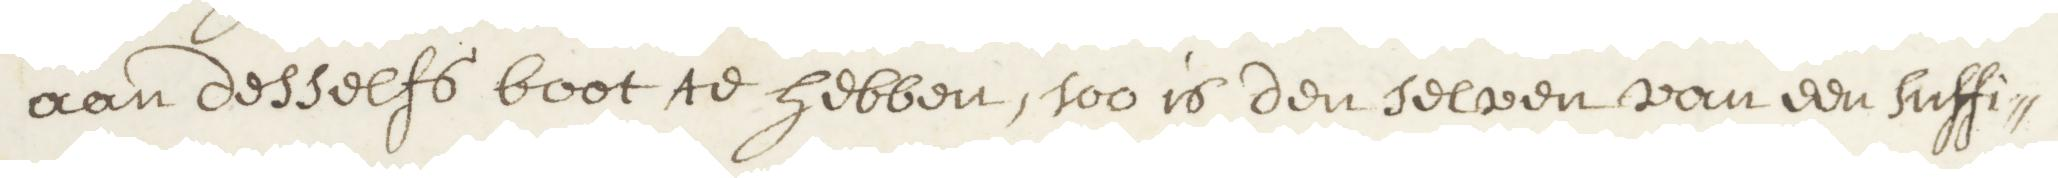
aan desselfs boot te hebben, soo is den selven van een suffi„
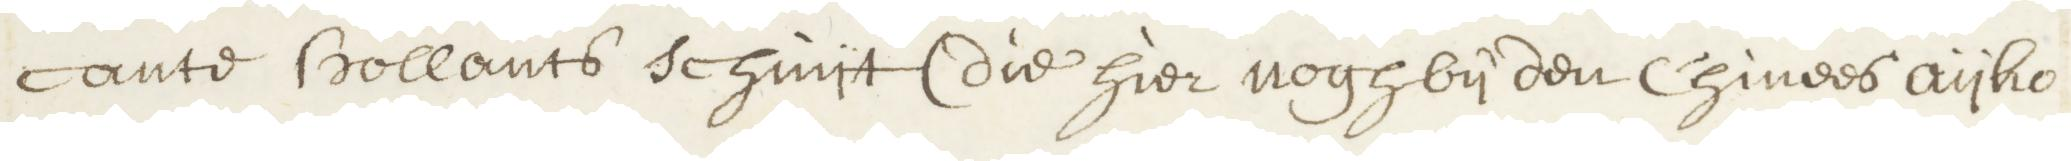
cante Hollants schuijt (die hier nogh bij den chinees aijko
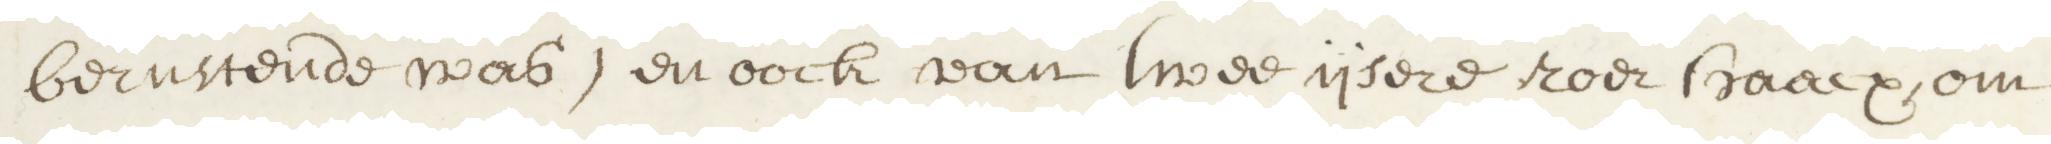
berustende was) en oock van twee ijsere roer haacx, om
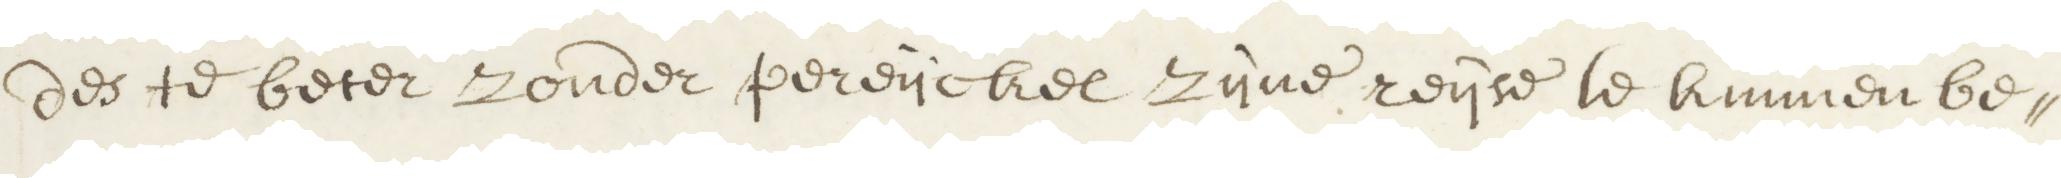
des te beter zonder pereijckel zijne reijse te kunnen be„
